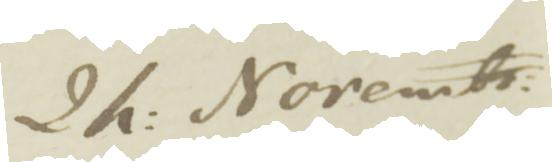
24: Novembr:
